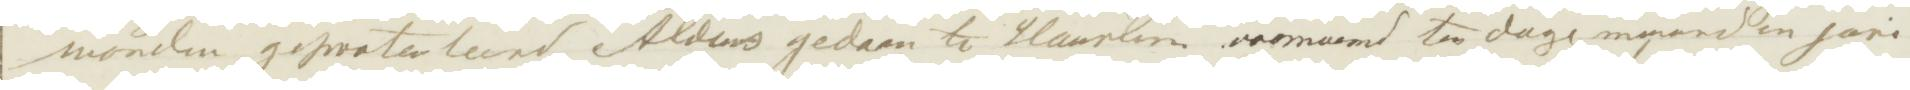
worden geprotesteerd Aldus gedaan te Haarlem voornoemd ten dage maand en jare
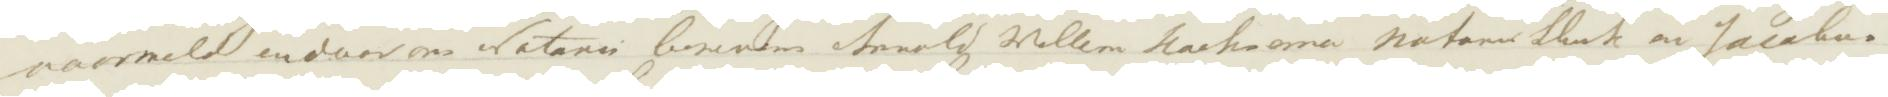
voormeld en door ons Notaris benevens Arnold Willem Haeksema Notaris klerk en Jacobus
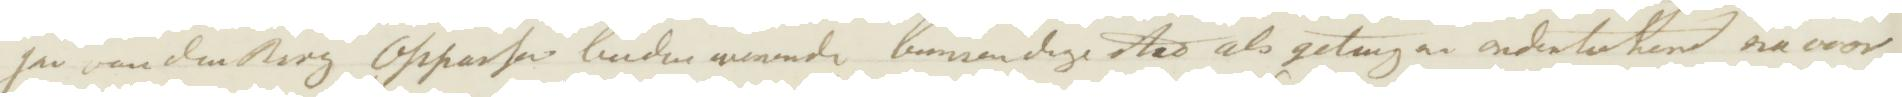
Jan van den Berg Oppasser beiden wonende binnen dege stad als getuigen onderteekend na voor
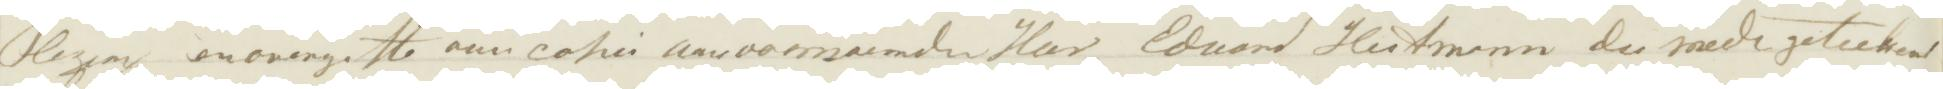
lezing en overgifte van copie aan voornoemden Heer Eduard Heitmann die mede geteekend
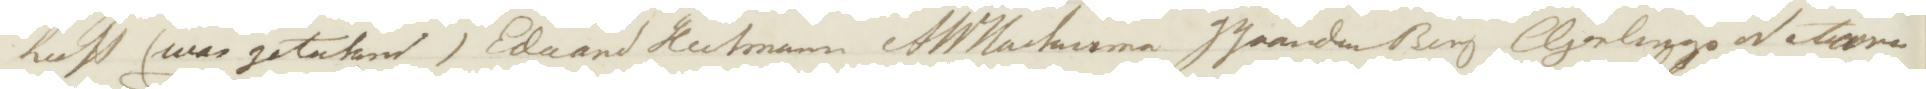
heeft (was geteekend) Eduard Heitmann AWHeitmann J J vanden Berg C Gerlings Notaris
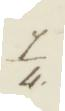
7/4.
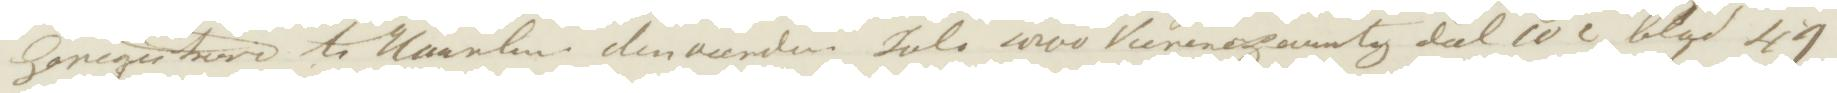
Geregisteerd te Haarlem den vierden Iuli 1800 Vierenzeventig deel 102 blad 49
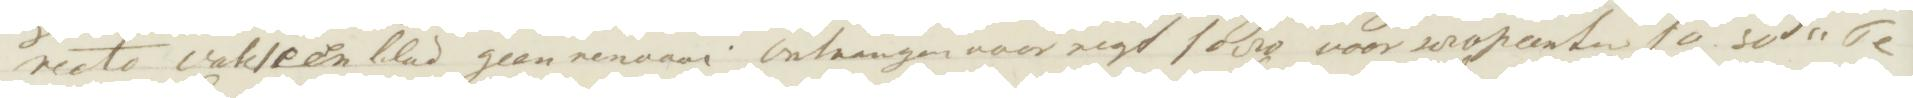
recto vak I Een blad geen renvooi ontvangen voor regt ƒ 0 80 voor 38 opcenten ƒ 0.30" Te
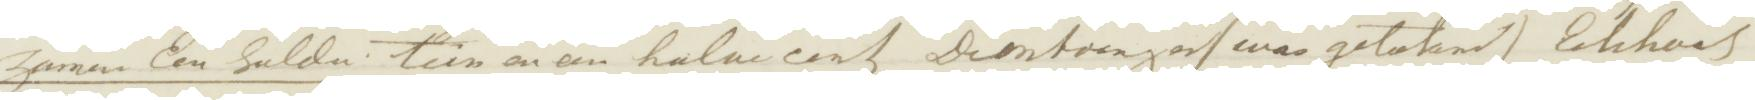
zamen Een Gulden tien en een halve cent De ontvanger (was geteekent) Eekhout
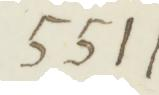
5511
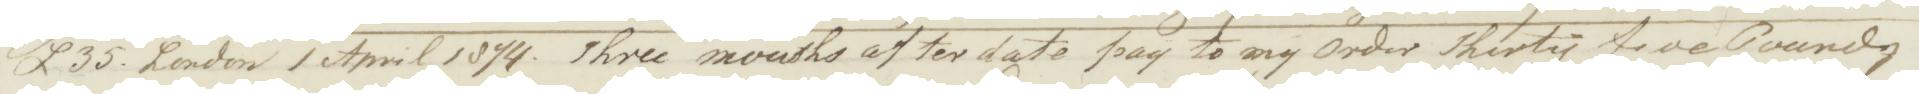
L35. London 1 April 1874. Three months after date paij to mij Order thirtij five Pounds
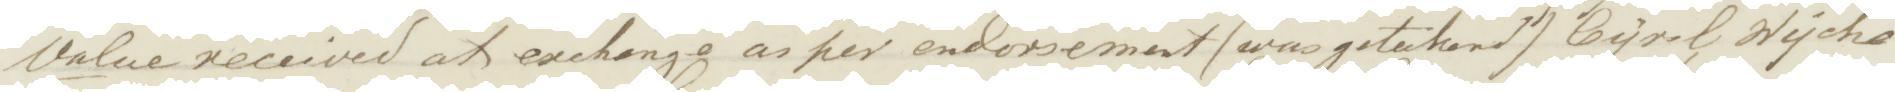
Value received at exchange as per endorsement (was geteekend) Cijrel Wijche
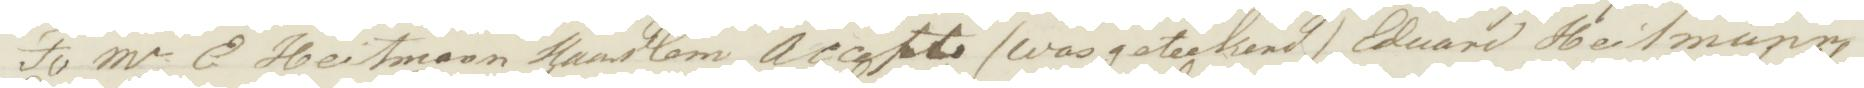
To m.r E Heitmann Haarlem Accepte (was geteekend) Eduard Heitmann
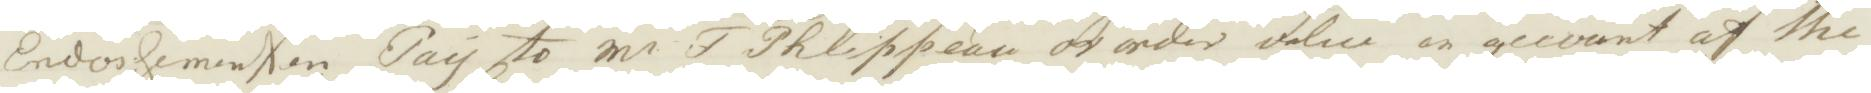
Endossementen Paij to mr. T Philippeau or order value in account of the
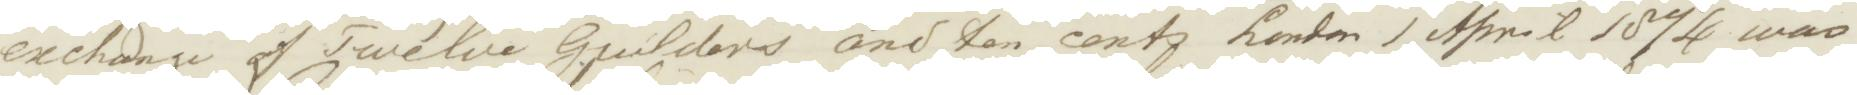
exchange of Twelve Guilders and ten cents London 1 April 1874 was
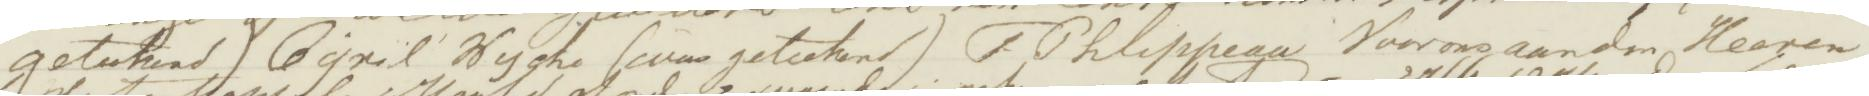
geteekend) Cijril Wyche (was geteekend) T Philippeau Voor ons aan den Heeren
